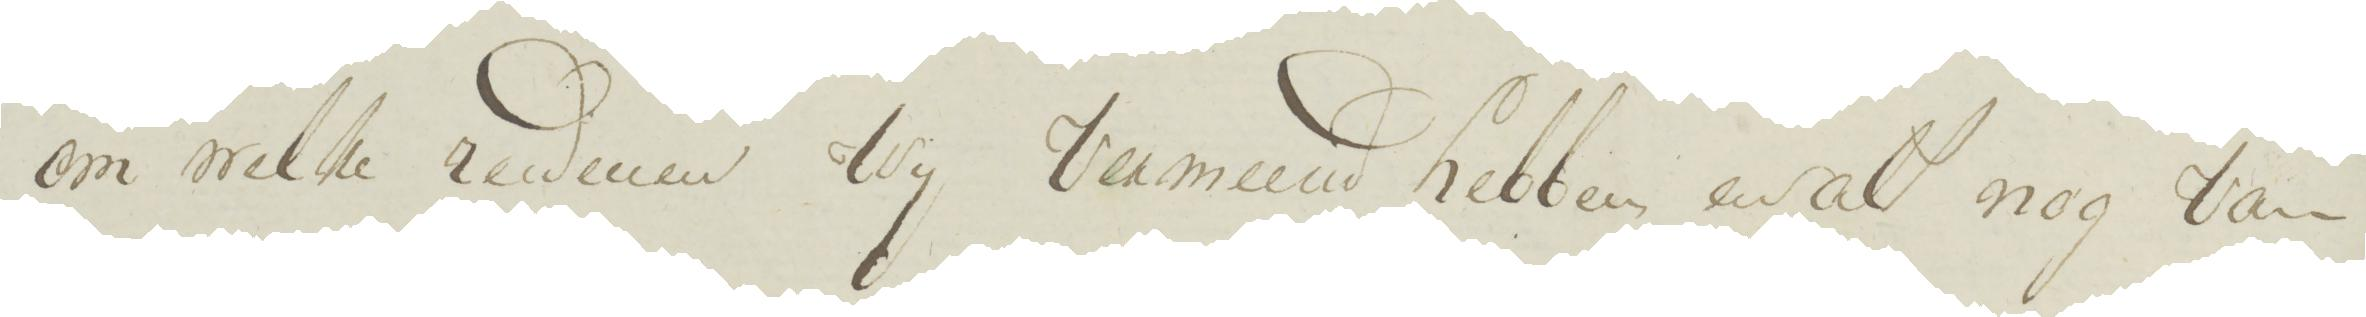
om welke reedenen wij vermeend hebben en als nog van
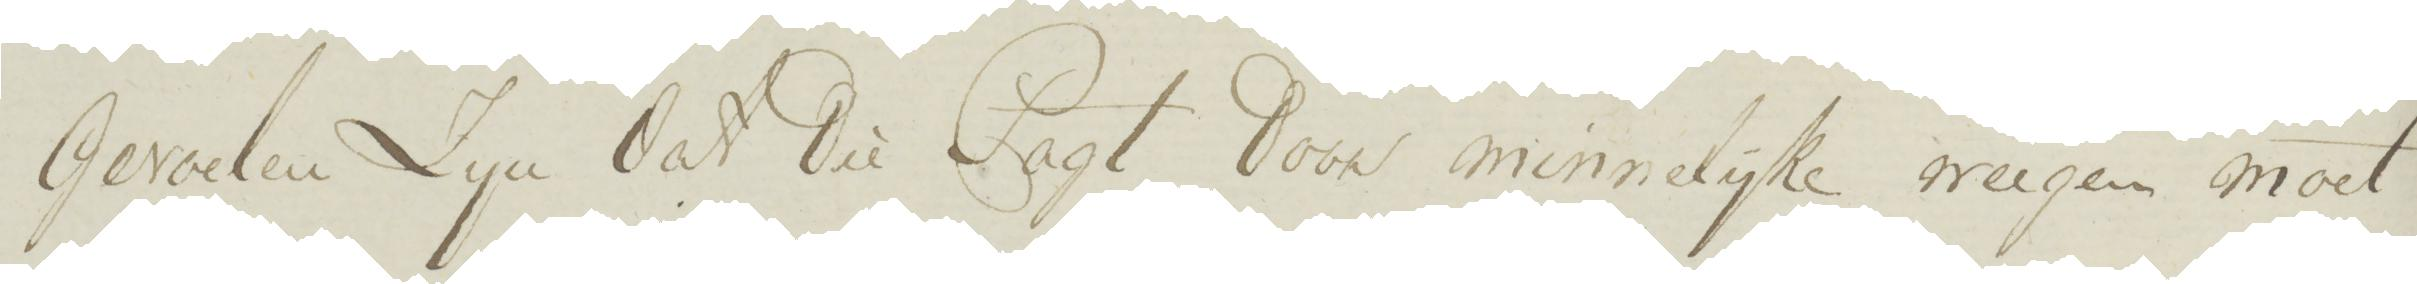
gevoelen zyn dat die Pagt door minnelijke weegen moet
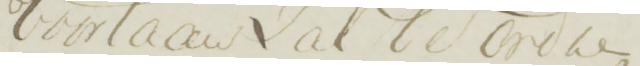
voortaan zal de ordren
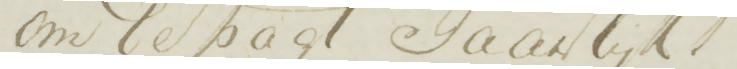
om de pagt Iaarlijks
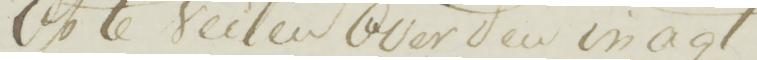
Op te veilen over den in agt
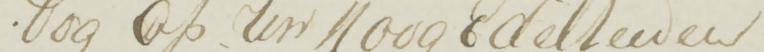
dog op uw Hoog Edelheeden
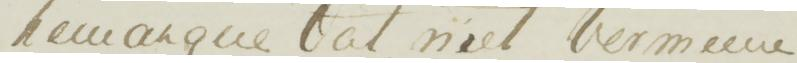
remarque dat niet vermeene
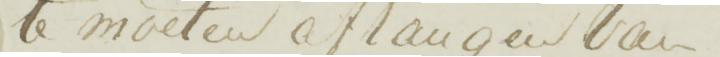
te moeten afhangen van
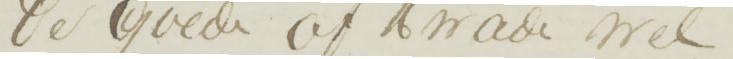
de goede of kwade wel
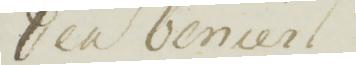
der boniers
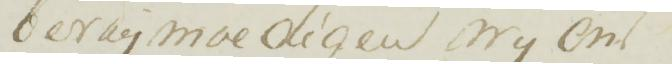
bevrijmoedigen wij ons
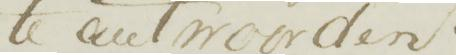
te antwoorden
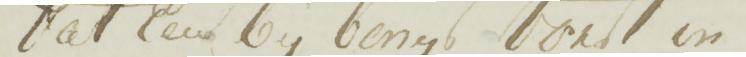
dat Een bij bonijs vorst in
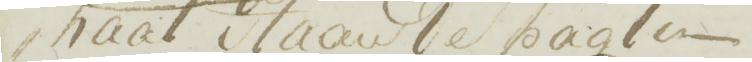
„haat staande pagter
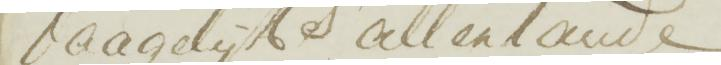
daagelijk s' allerhande
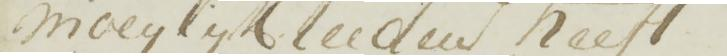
moeylijkheedens heeft
